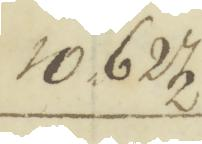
10„62½
